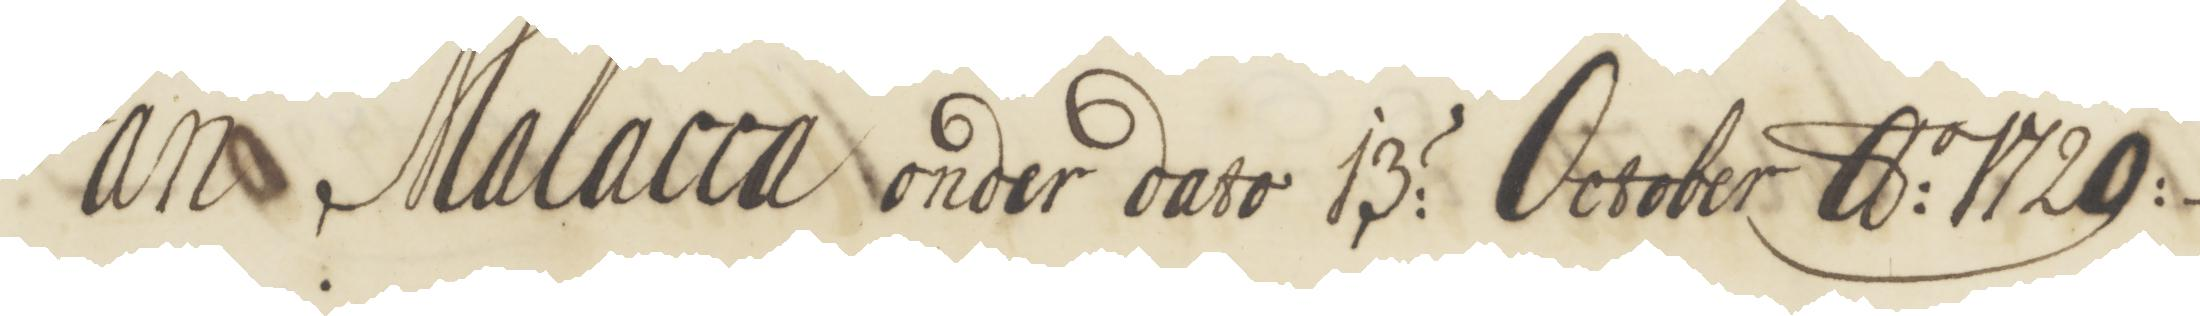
Van Malacca onder dato 13:' October A:o 1729:
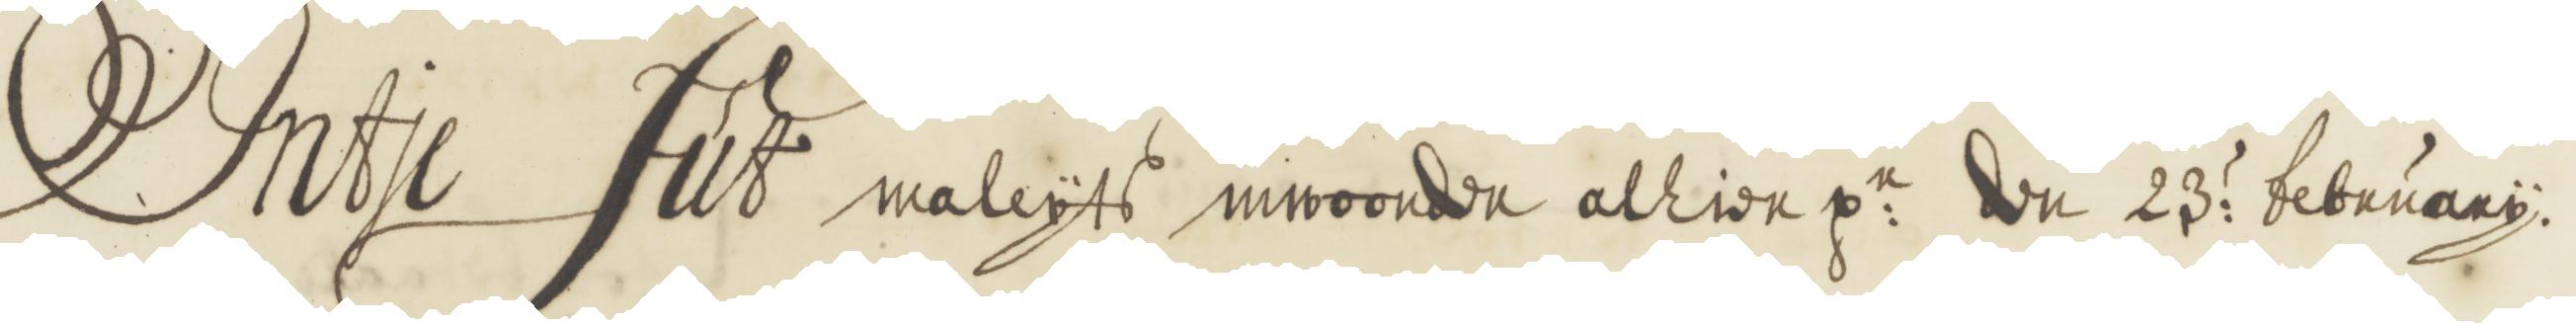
Intje Fut maleijts inwoonder alhier p:r den 23:' februarij.
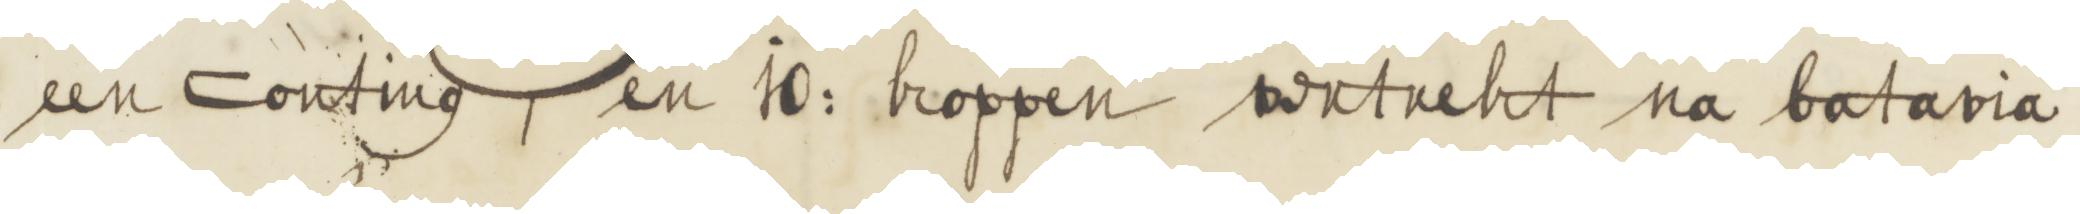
een conting, en 10: koppen vertrekt na batavia
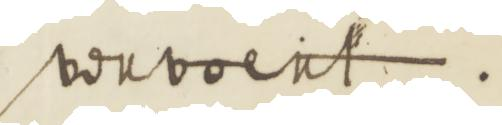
vervoert.
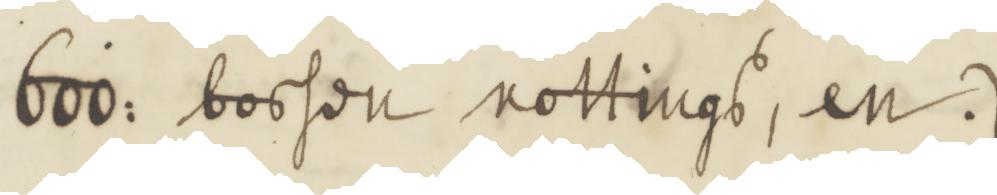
600: bossen rottings, en.
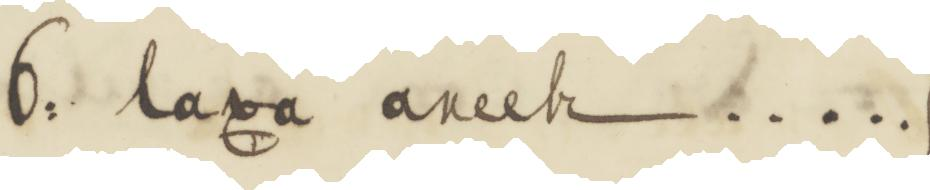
6: taxa areek . . . . .
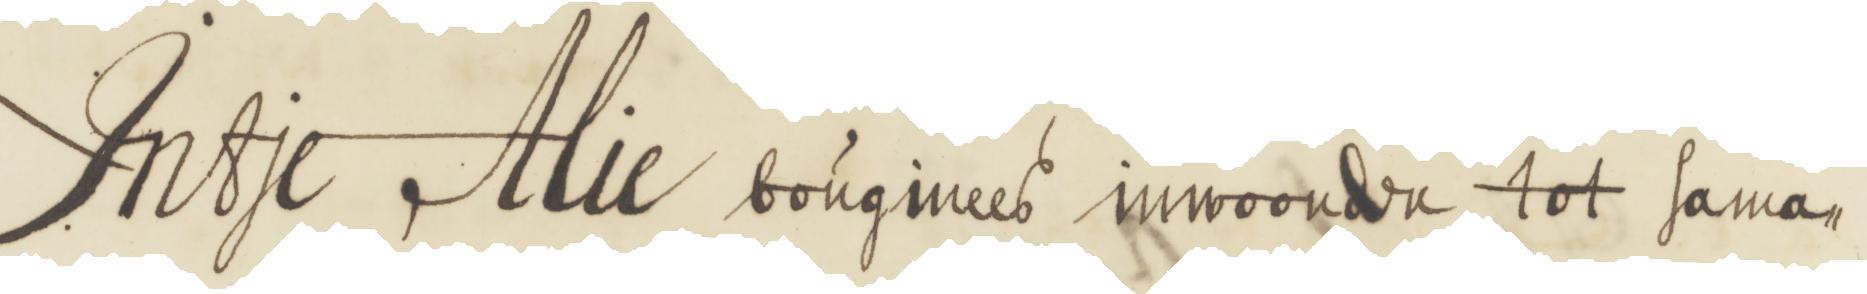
Intje Alie bouginees inwoonder tot sama„
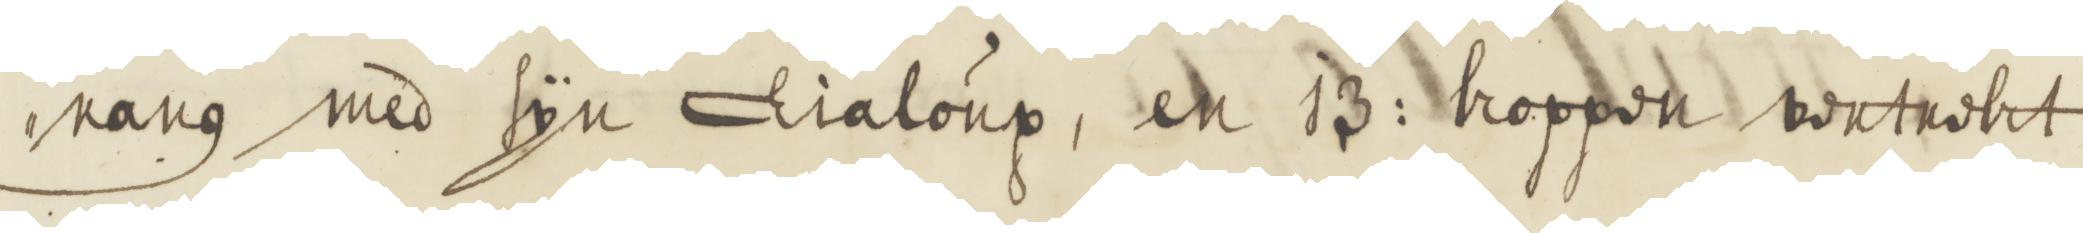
„rang med sijn chialoup, en 13: koppen vertrekt
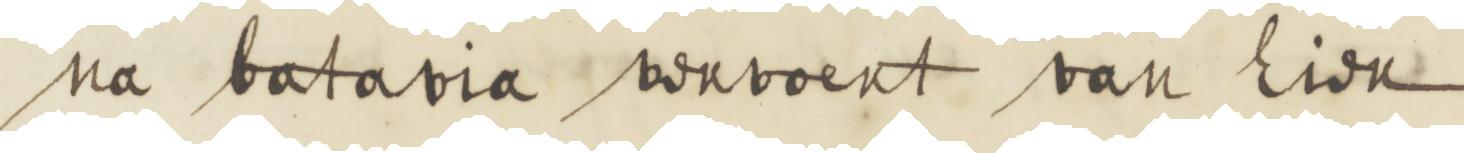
na batavia vervoert van hier.
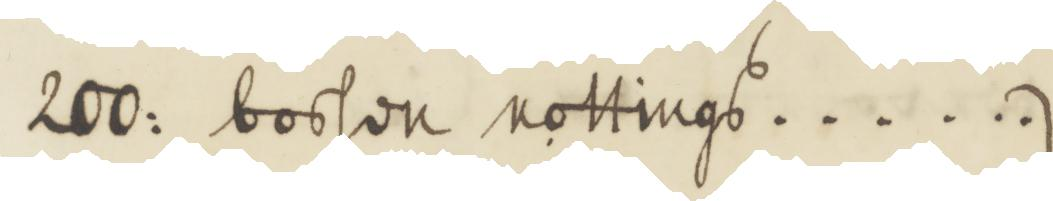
200: bossen rottings . . . . . .
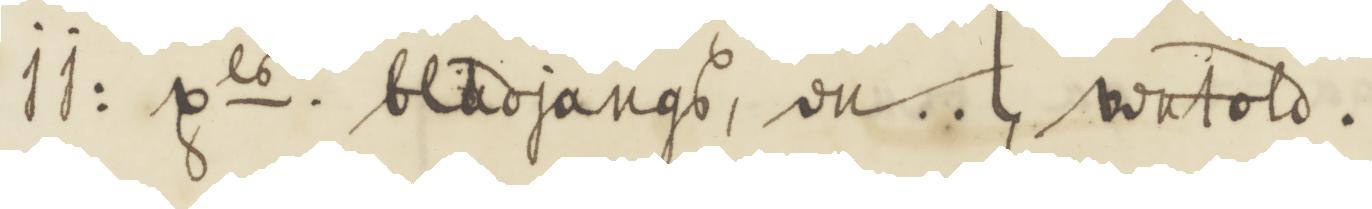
11: p-ls. bladjangs, en . . vertold.
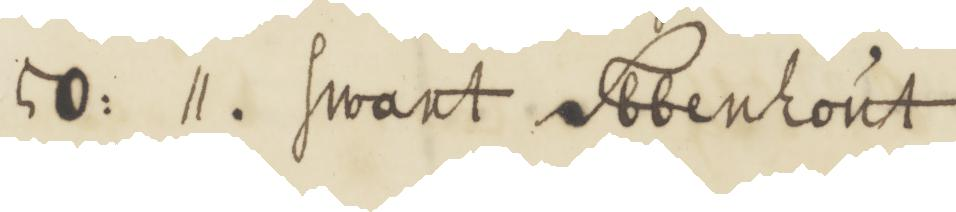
50: „. swart Ebbenhout.
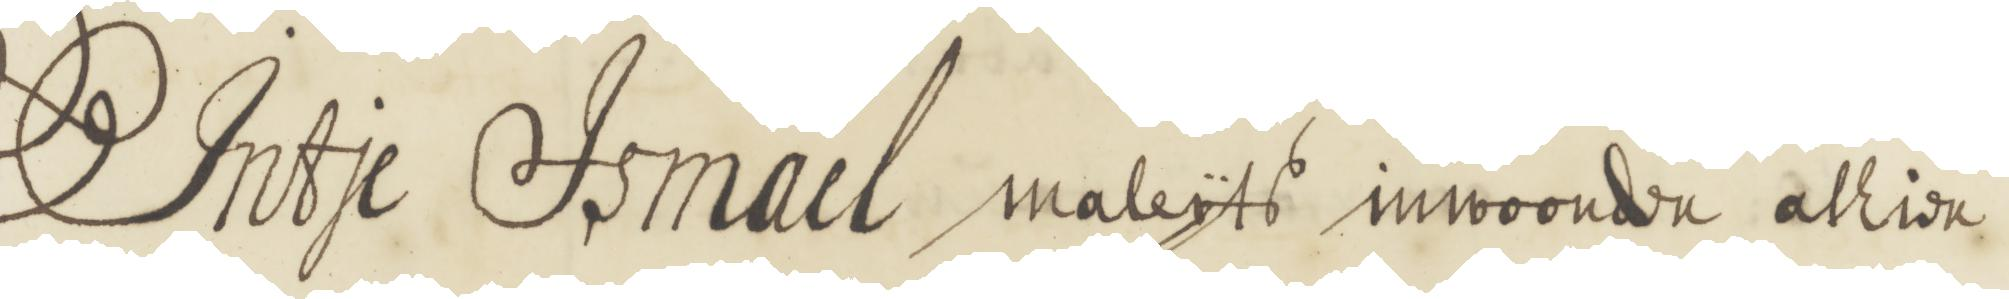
Intje Ismael maleijts inwoonder alhier
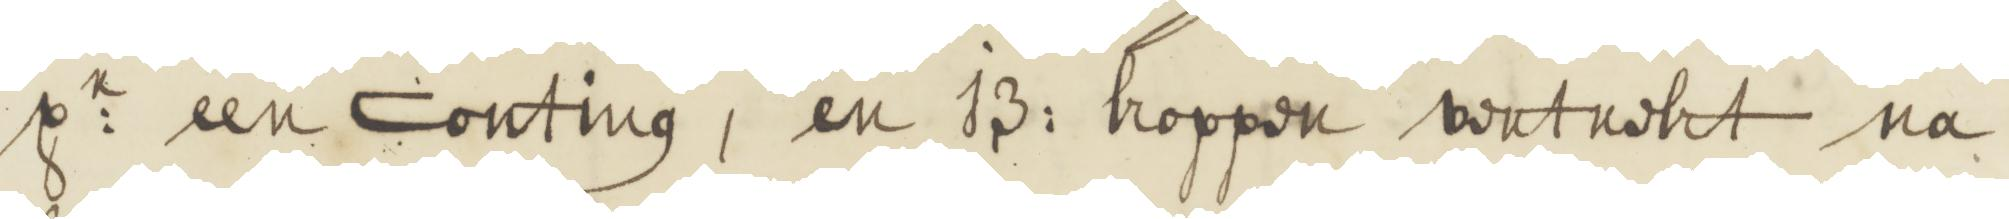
p:r een conting, en 13: koppen vertrekt na
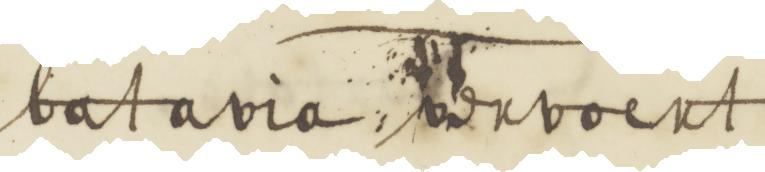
batavia vervoert.
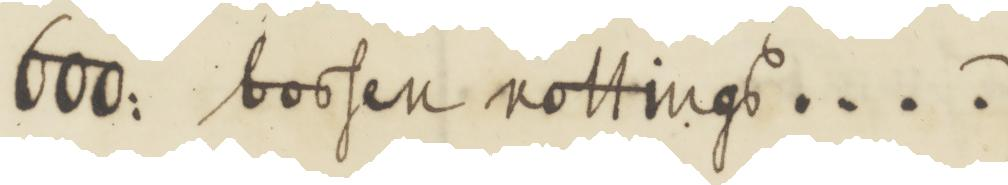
600: bossen rottings . . . .
